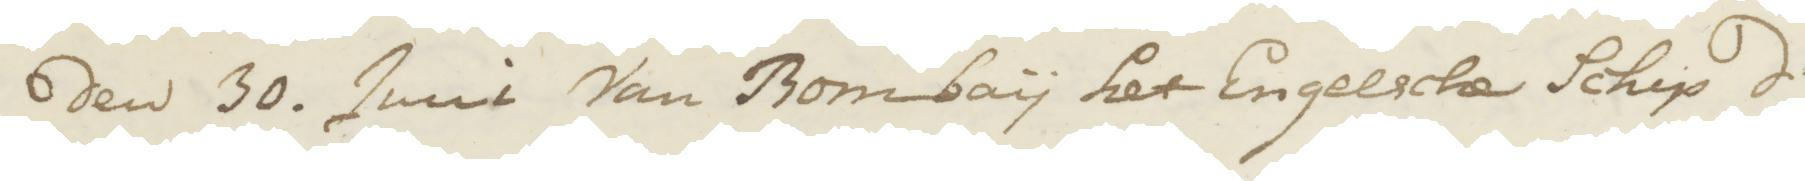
den 30. Juni van Bombaij het Engelsche schip d
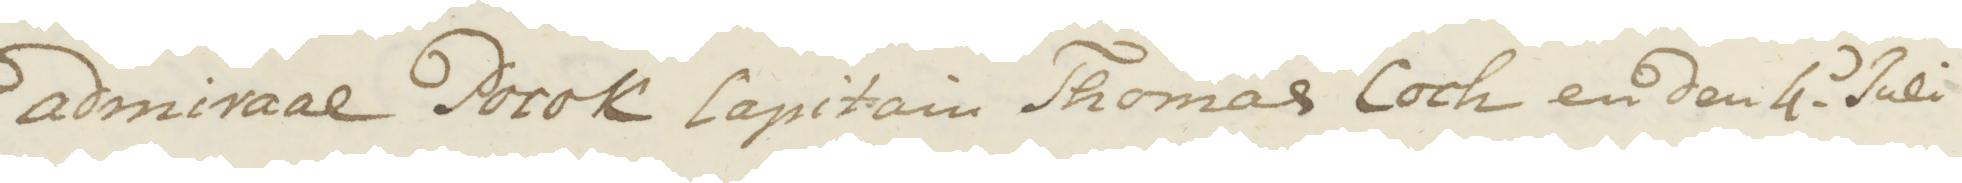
admiraal Pocok Capitain Thomas Coch en den 4.' Juli
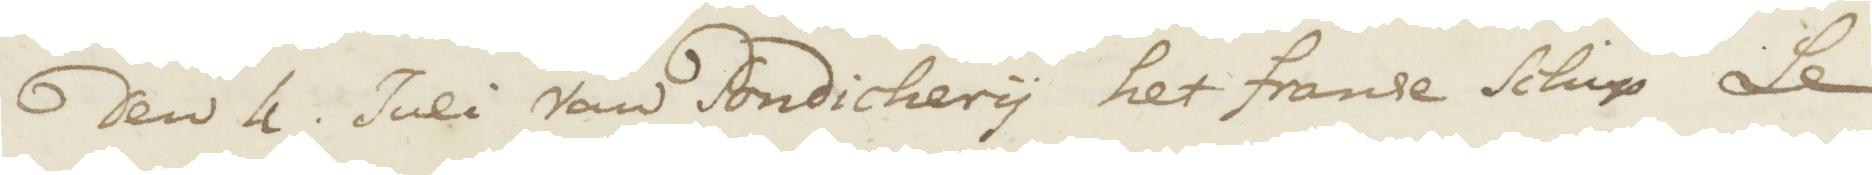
den 4. Juli van Pondicherij het franse schip Le
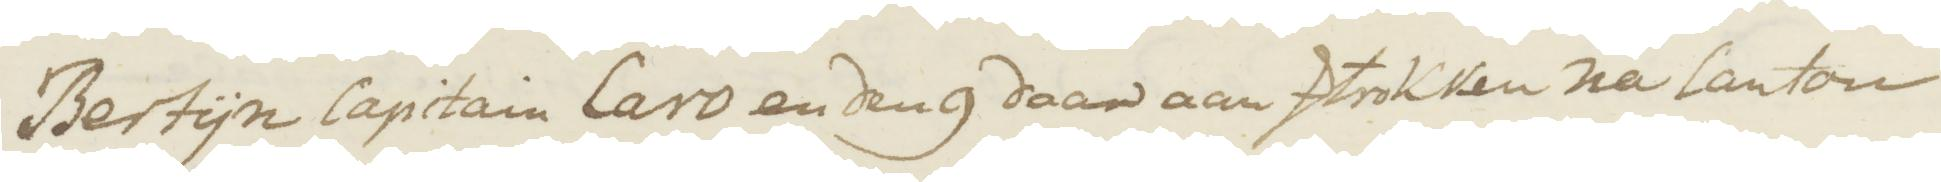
Bertijn capitain Caro en den 9 daar aan vertrokken na Canton
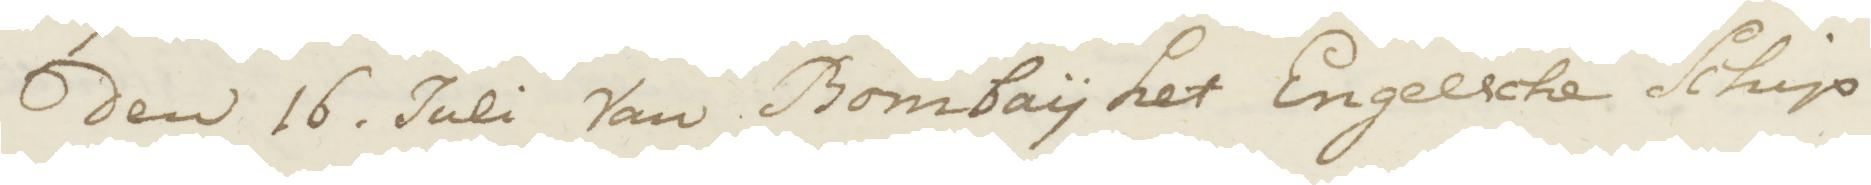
den 16. Juli van Bombaij het Engelsche schip
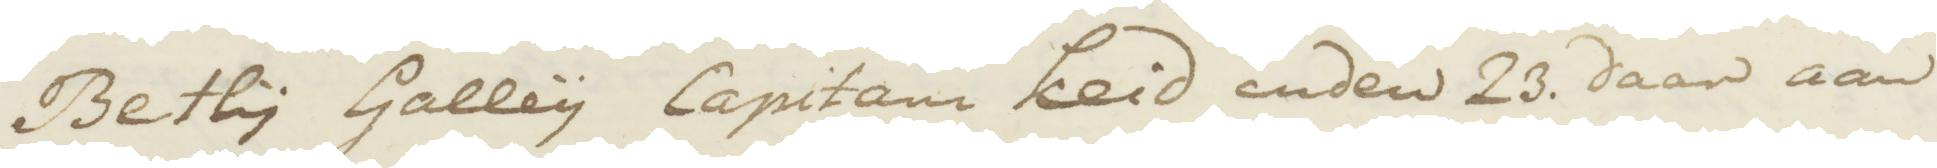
Betlij Galleij Capitain keid en den 23. daar aan
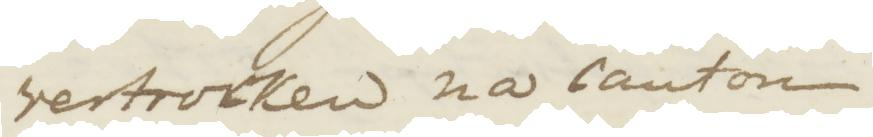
vertrokken na canton
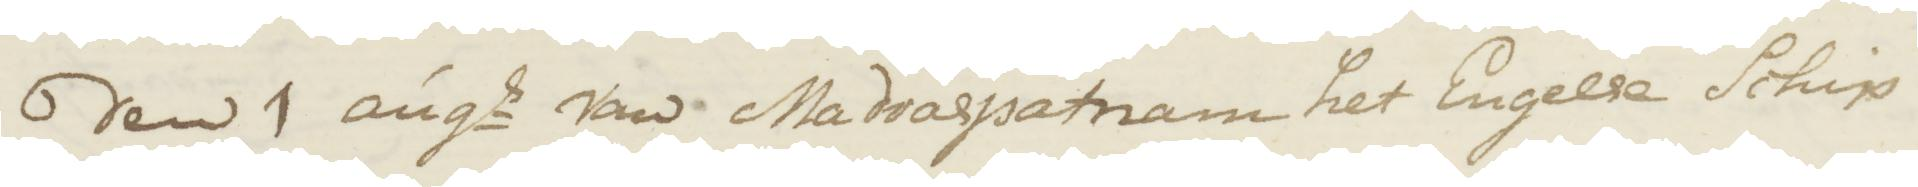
den 1 aug=s van Madraspatnam het Engelse schip
